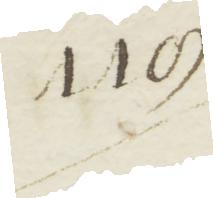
118
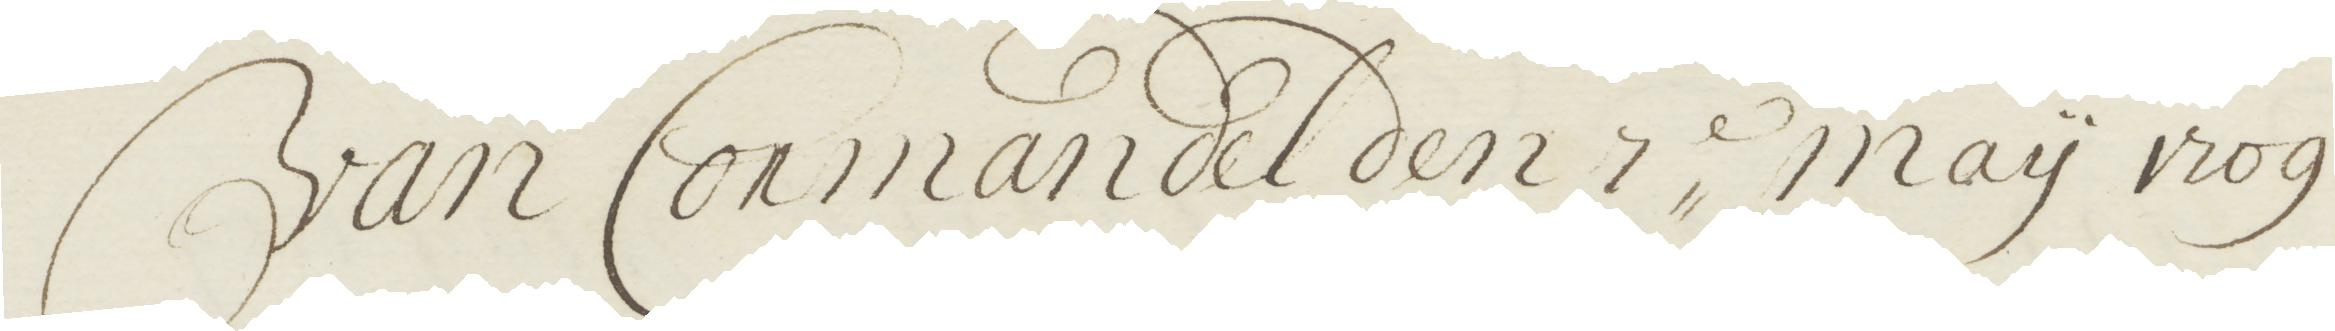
Van Cormandel den 7„e Maij 1709
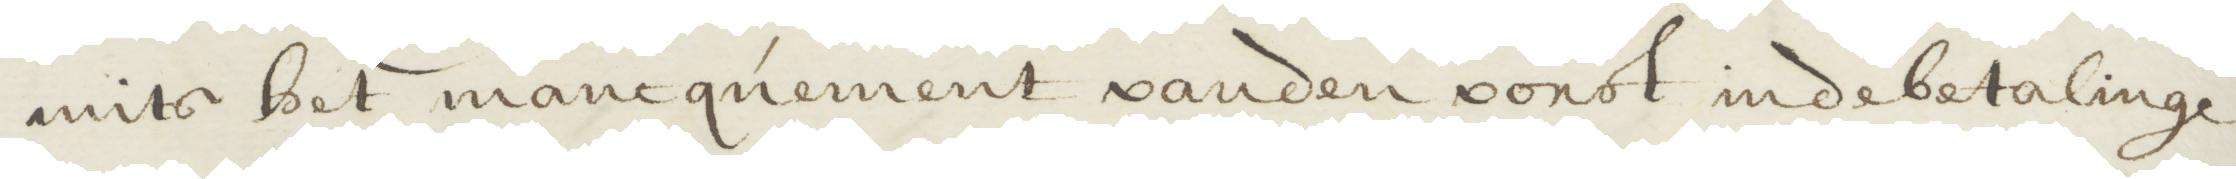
mits het mancquement van den vorst in de betalinge
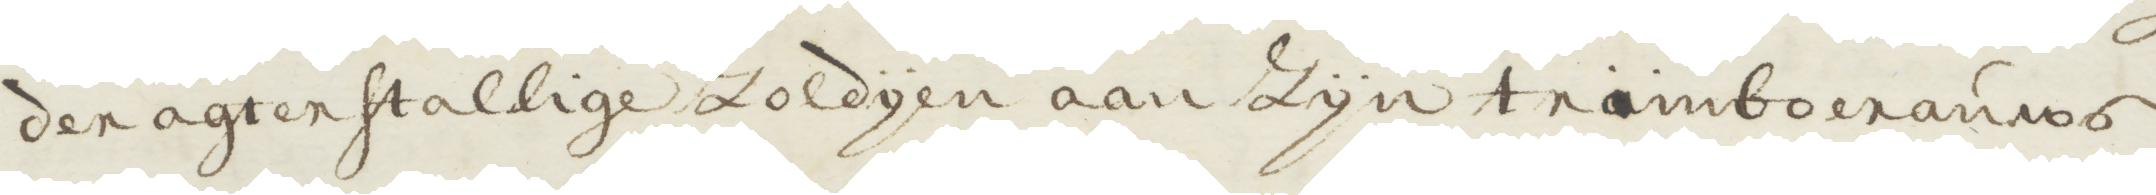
der agterstallige zoldijen aan zijn trainboerauws
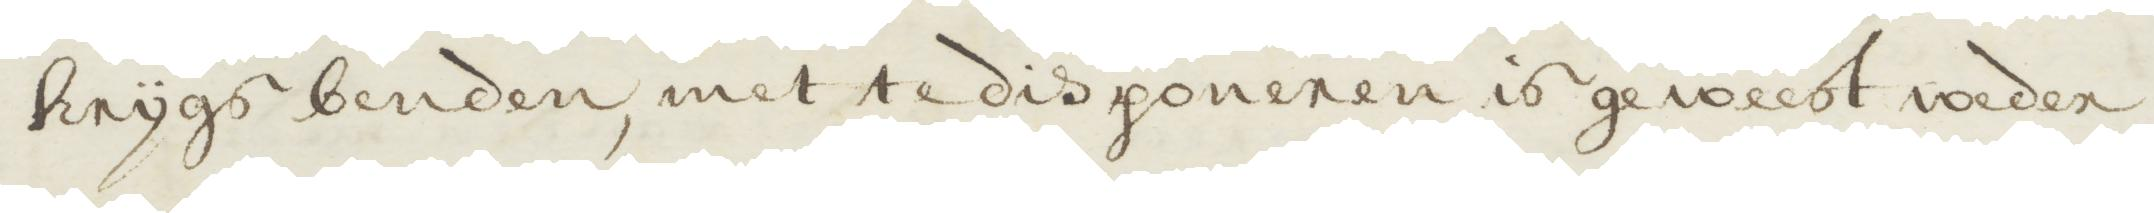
krijgs benden, met te disponeren is geweest weder
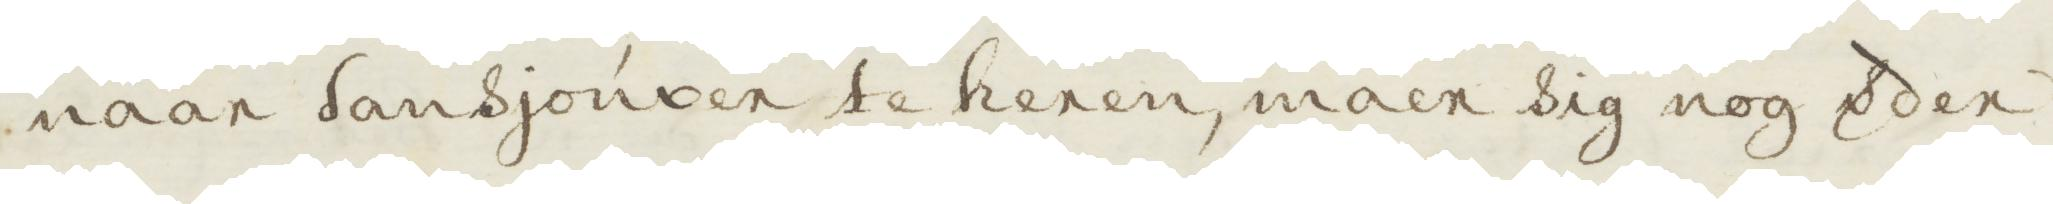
naar tansjouver te keren, maer sig nog verder
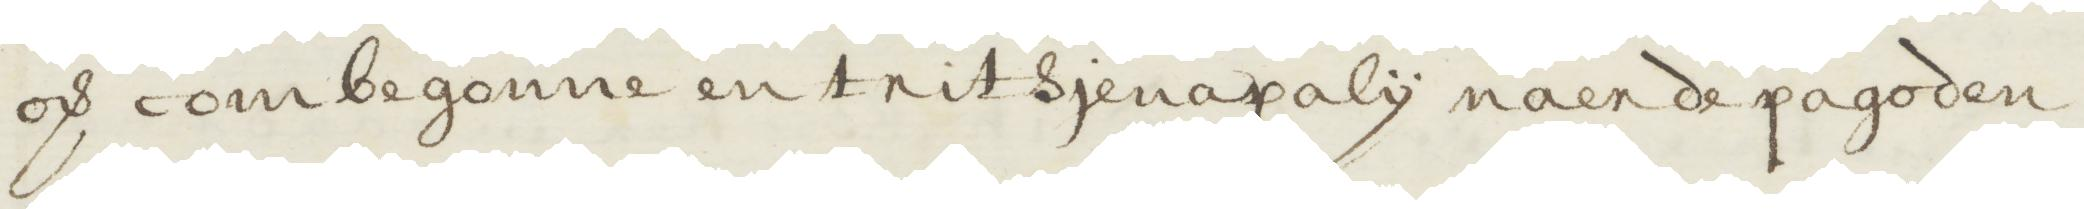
over, combegonne en tritsjenapalij naer de pagoden
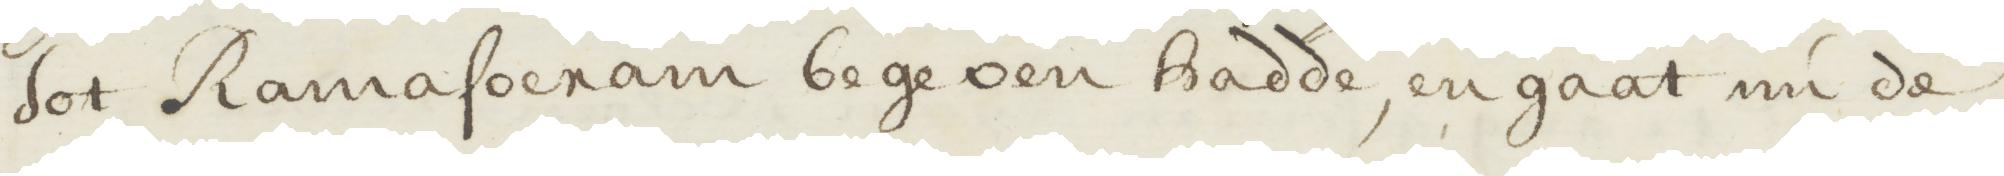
tot Ramasoeram begeven hadde, en gaat nu de
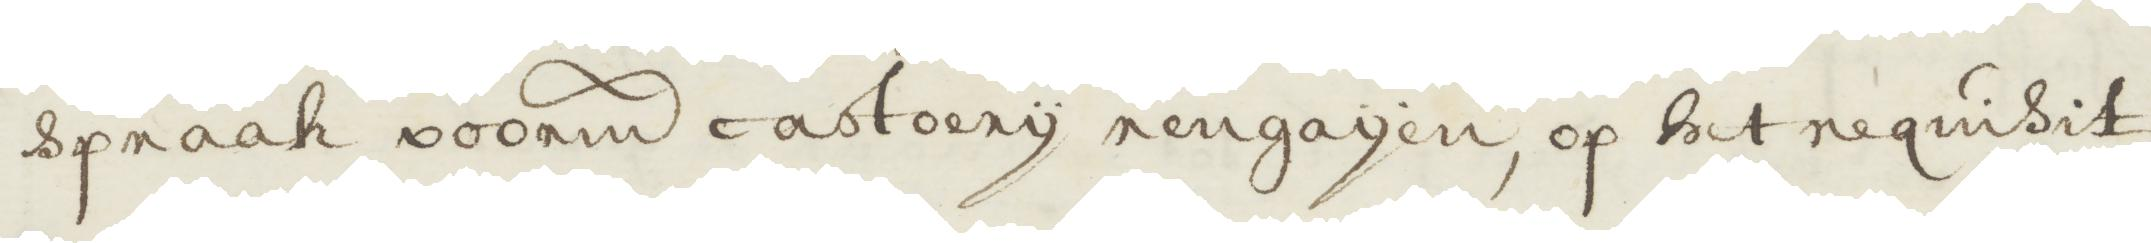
spraak voorm castoerij rengaijen, op het requisit
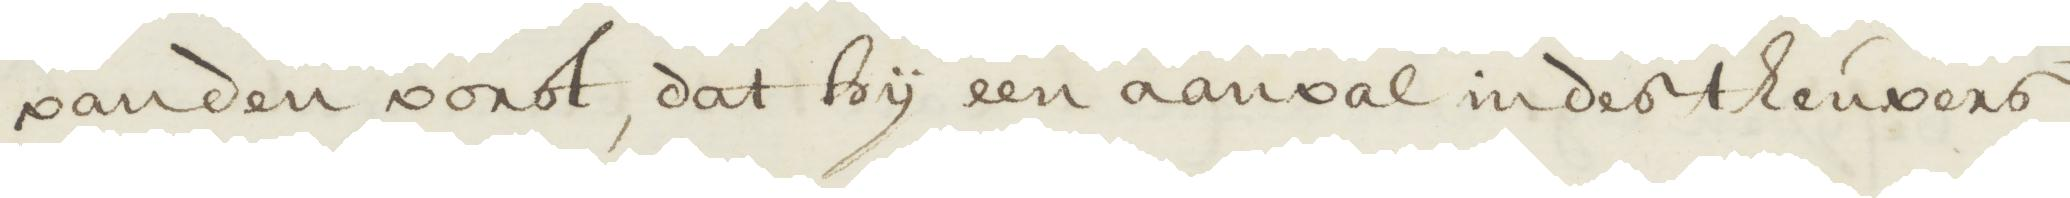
vanden vorst, dat hij een aanval in des theuvers
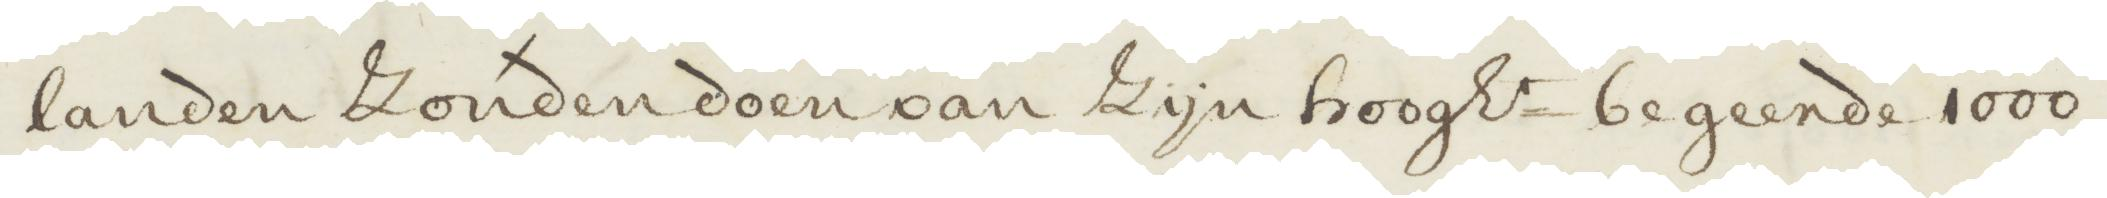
landen zouden doen van zijn hoogh=t begeerde 1000
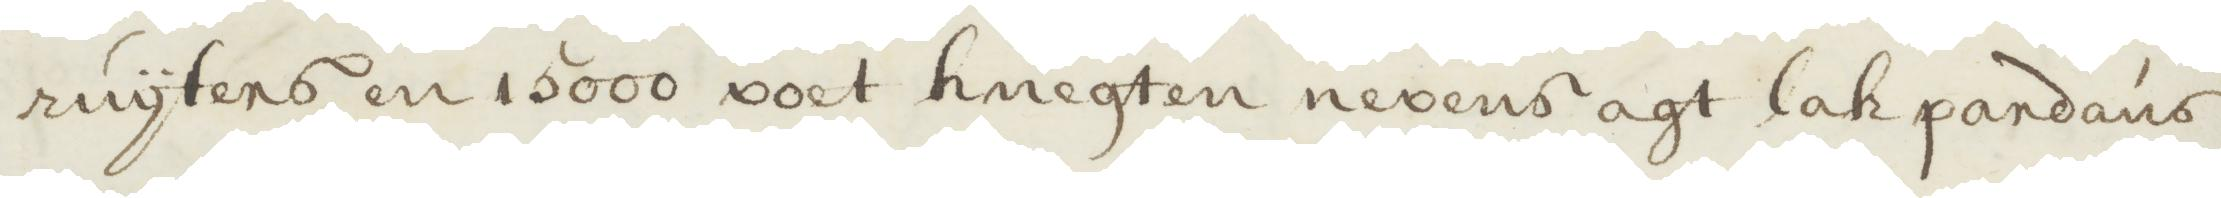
ruijters en 15000 voet knegten nevens agt lakpardaus
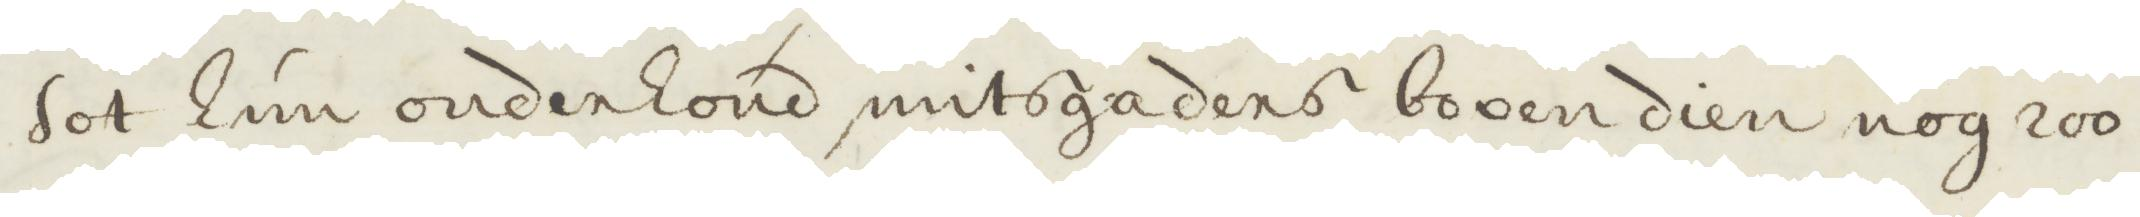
tot hun onderhoud, mitsgaders boven dien nog 200
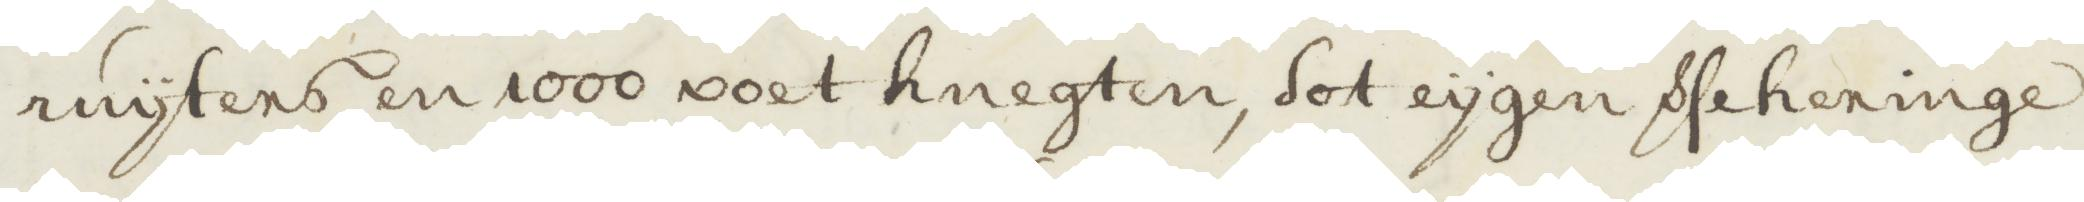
ruijters, en 1000 voet knegten, tot eijgen versekeringe
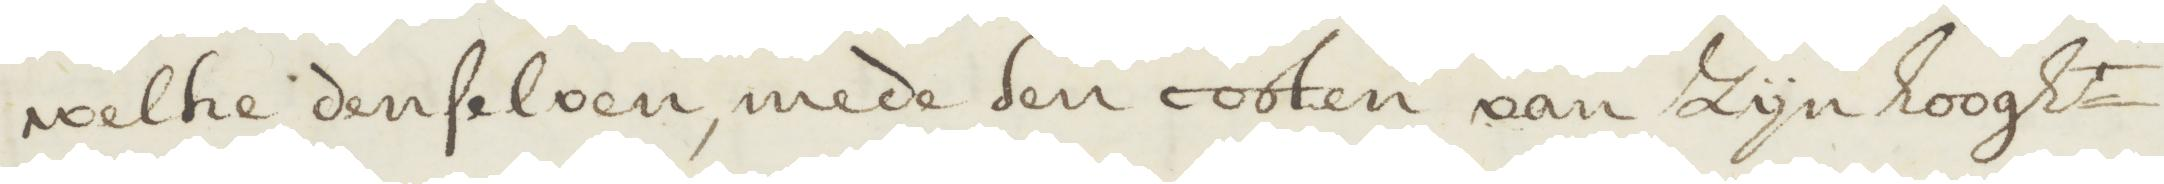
welke denselven, mede ten costen van zijn hoogh=t
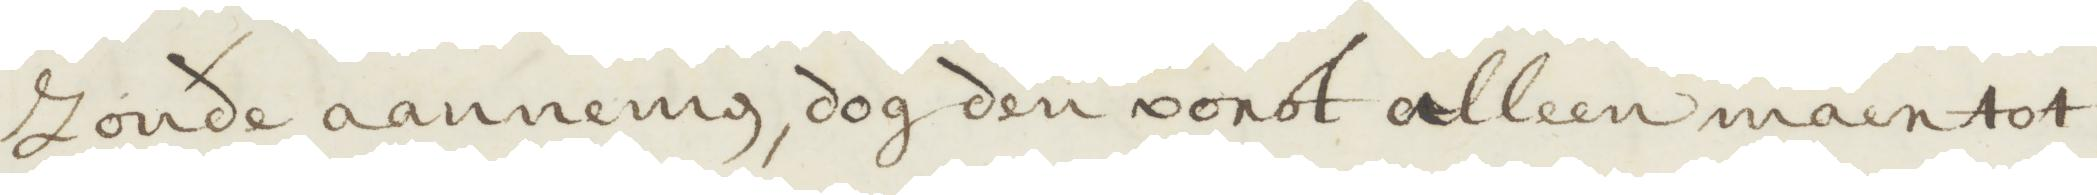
zoude aannemen, dog den vorst alleen maer tot
